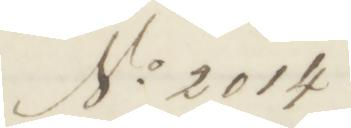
N=o 2014
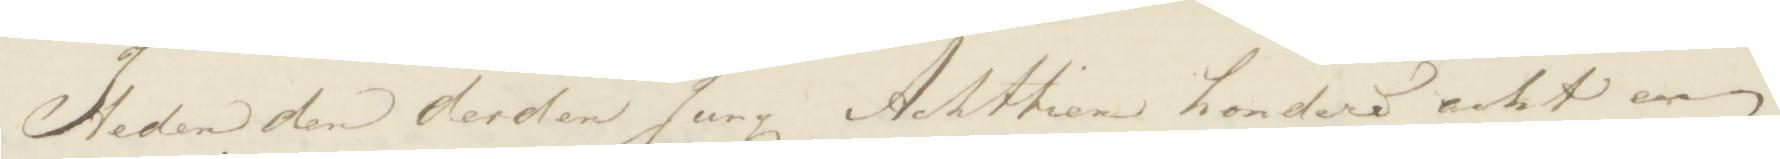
Heden den derden Juny Achttien honderd acht en
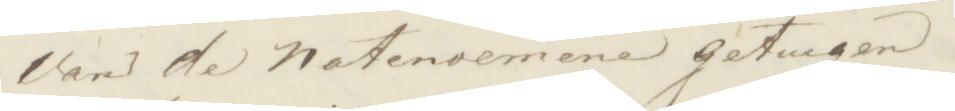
van de natenoemene getuigen
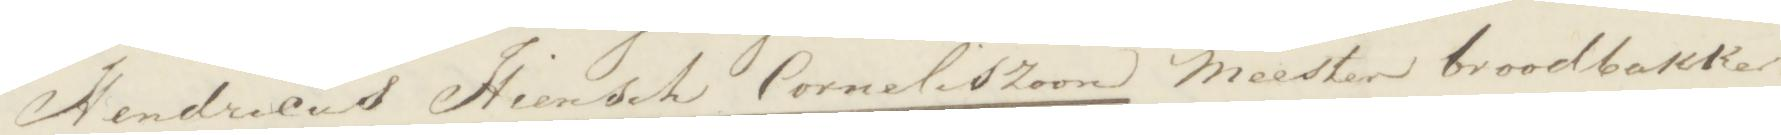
Hendricus Hiensch Corneliszoon meester broodbakker
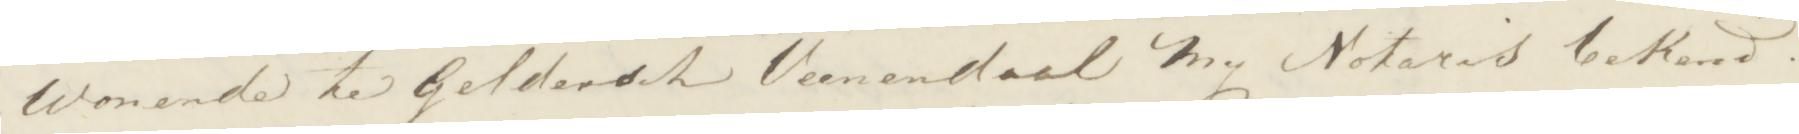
wonende te Geldersch Veenendaal my Notaris bekend.
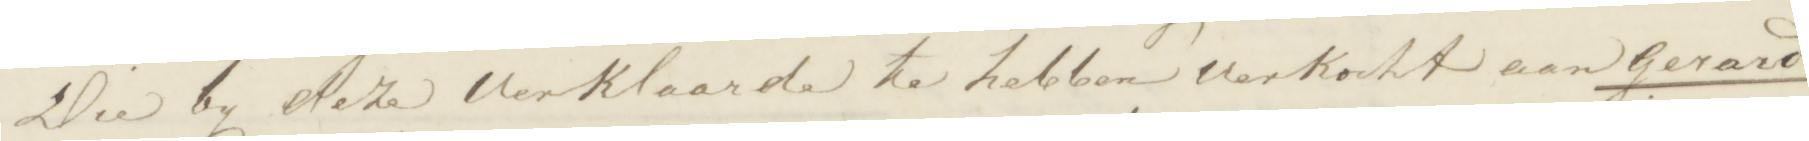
Die by deze verklaarde te hebben verkocht aan Gerard
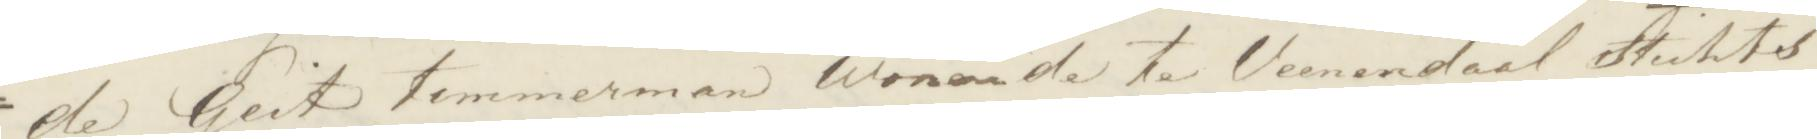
de Geit timmerman wonende te Veenendaal stichts
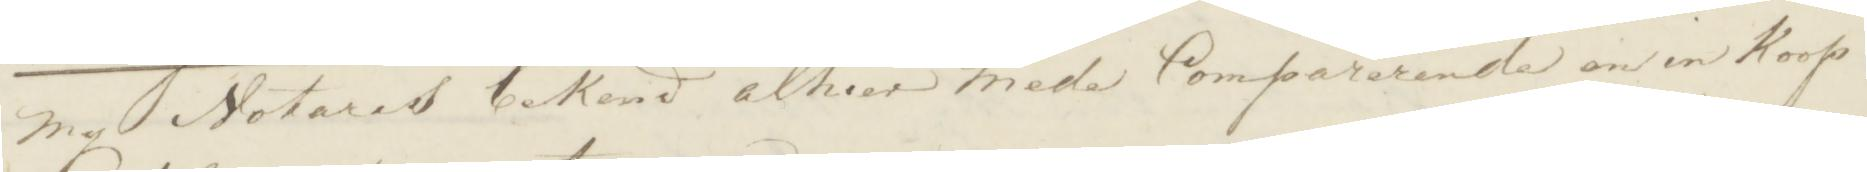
my Notaris bekend alhier mede Comparerende en in koop
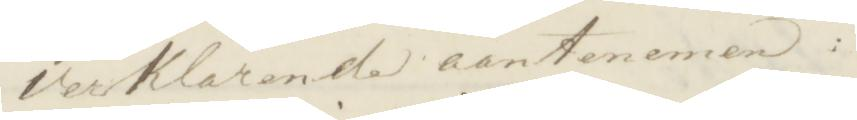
verklarende aantenemen:
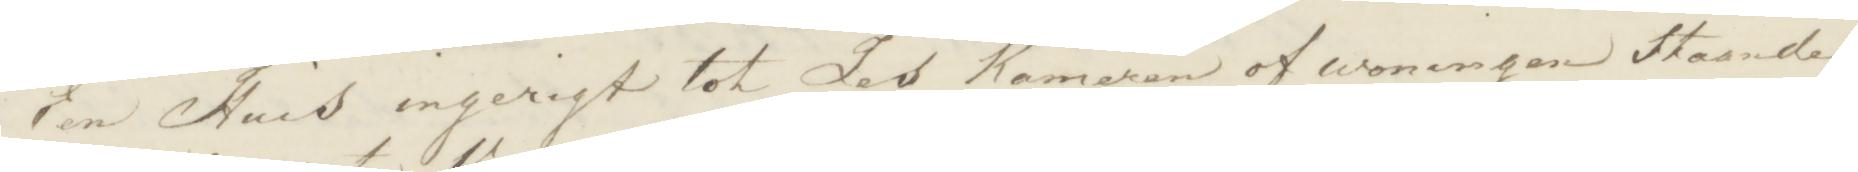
Een Huis ingerigt tot zes kameren of woningen staande
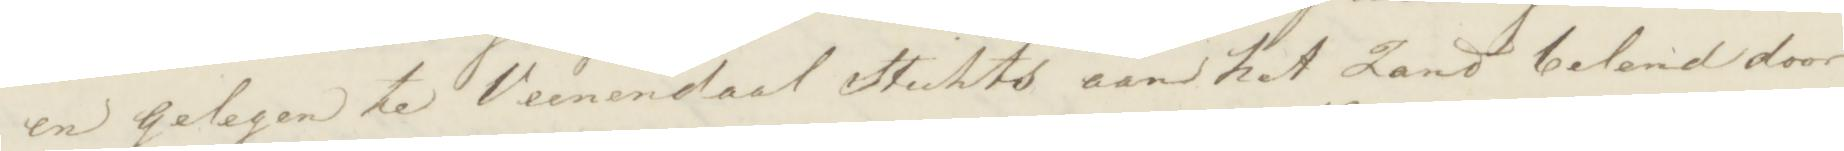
en gelegen te Veenendaal stichts aan het zand belend door
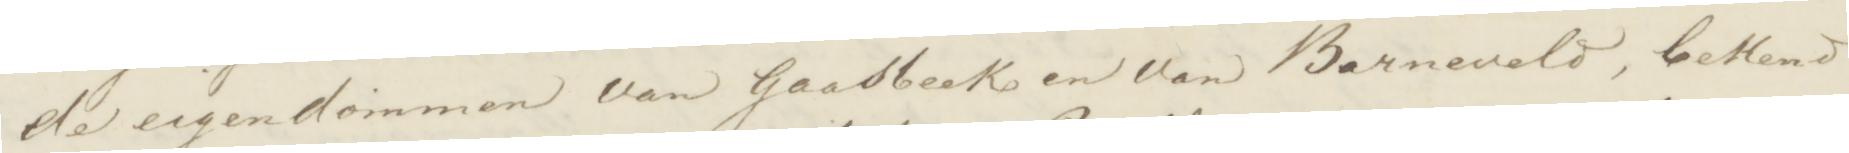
de eigendommen van Gaasbeek en van Barneveld, bekend
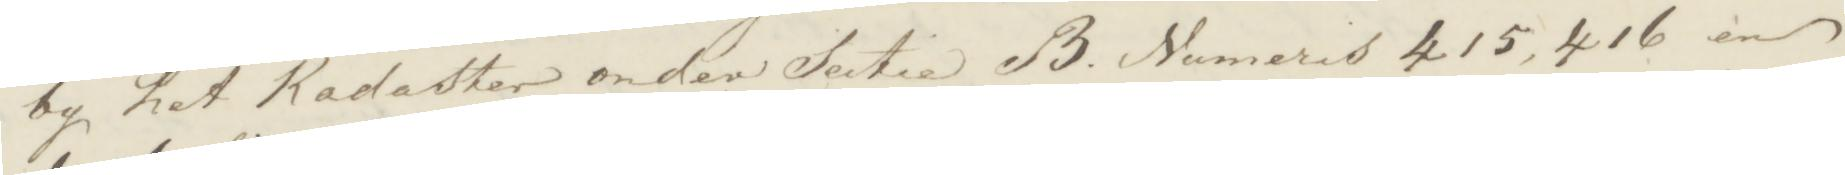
by het Kadaster onder sectie B. Numeris 415, 416 en
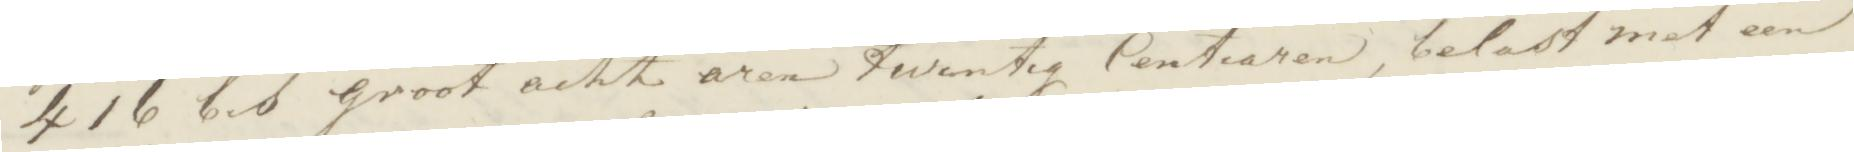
416 bis groot acht aren twintig Centiaren belast met een
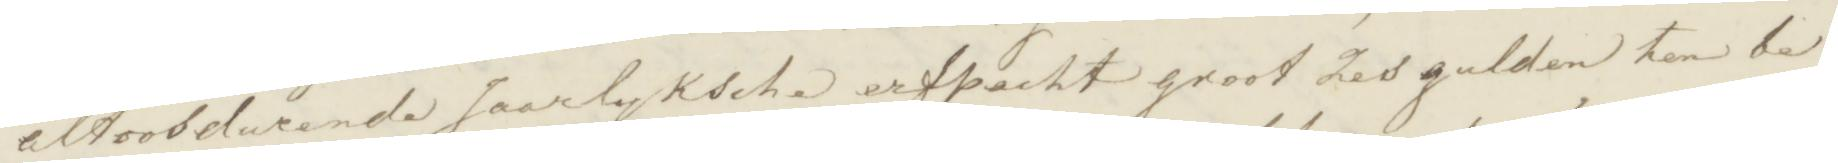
altoosdurende Jaarlyksche erfpacht groot zes gulden ten be
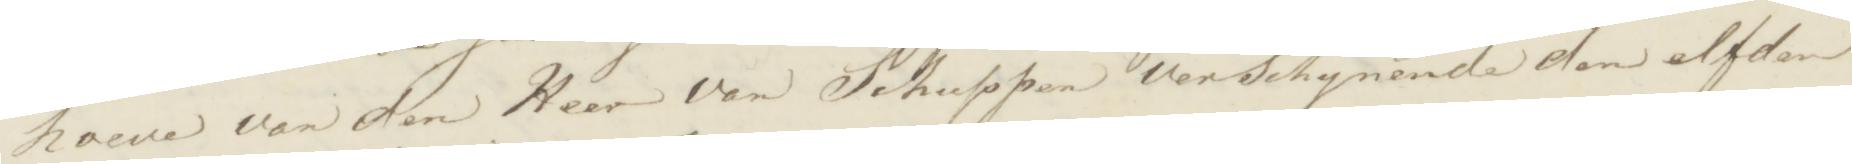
hoeve van den Heer van Schuppen verschynende den elfden
